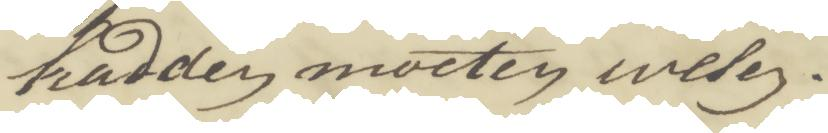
hadden moeten wesen.
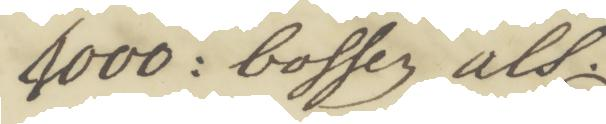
4000: bossen als.
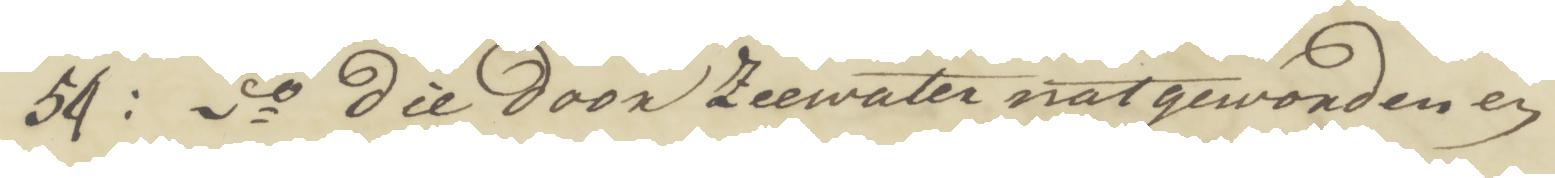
54: d=o die door zeewater nat geworden en
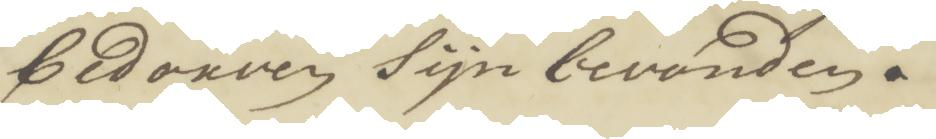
bedorven sijn bevonden.
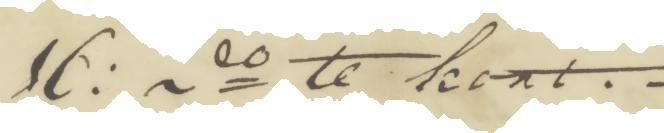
16: d=o te kort.
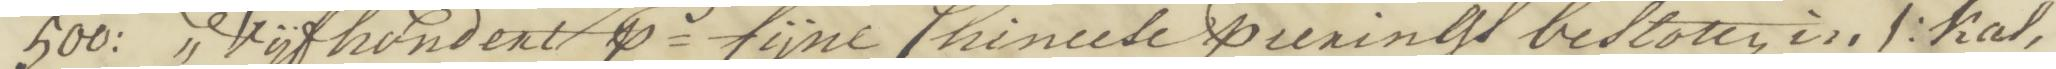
500: „ vijf hondert p=s fijne Chineese pierings besloten in 1: kas,
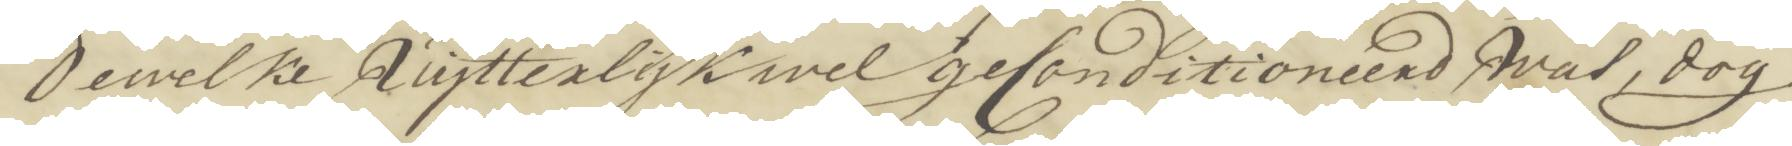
dewelke uijtterlijk wel geconditioneerd was, dog
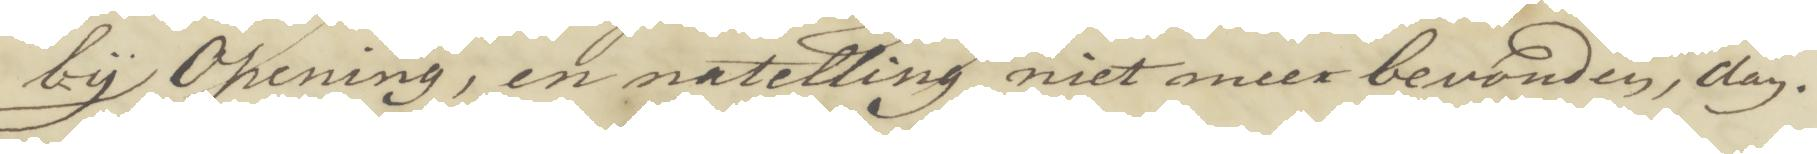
bij Opening, en natelling niet meer bevonden, dan.
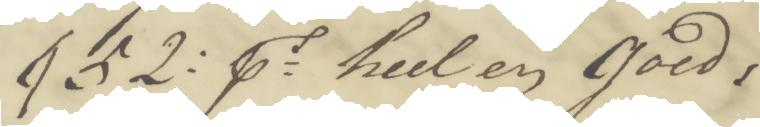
452: p=s heel en goed,
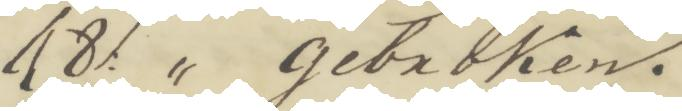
48: „ gebroken.
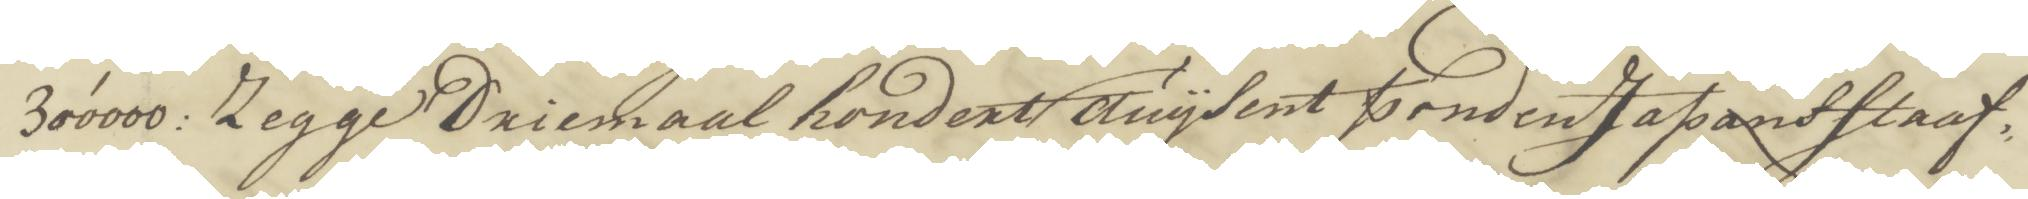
300000: zegge driemaal hondert duijsent ponden Japans staaf„
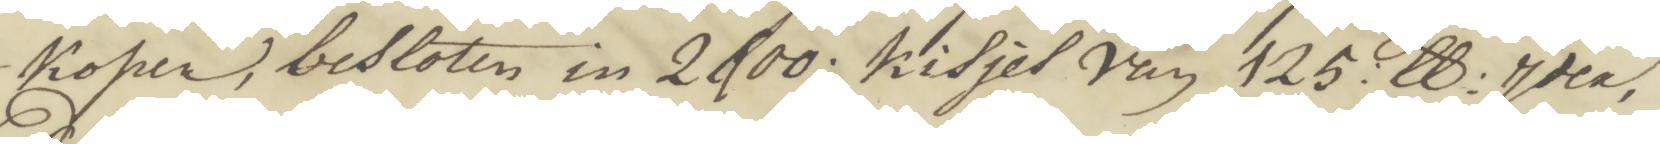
koper, besloten in 2400: kisjes van 125: lb: Jter,
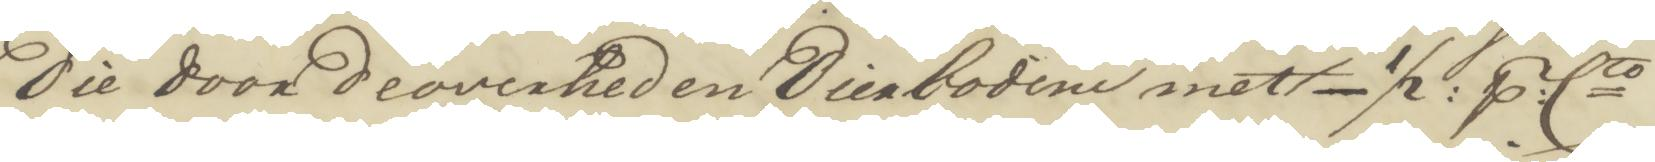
die door de overheden dier bodem met — ½: p:r C=to
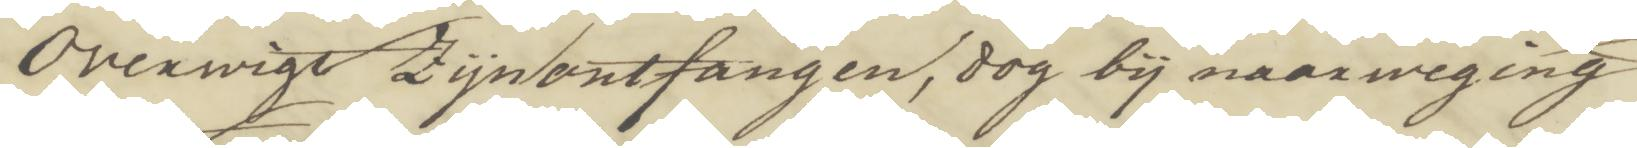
Overwigt zijn ontfangen, dog bij naarweging
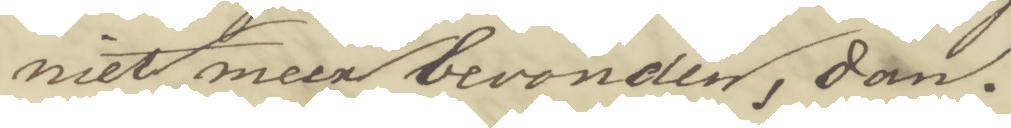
niet meer bevonden, dan.
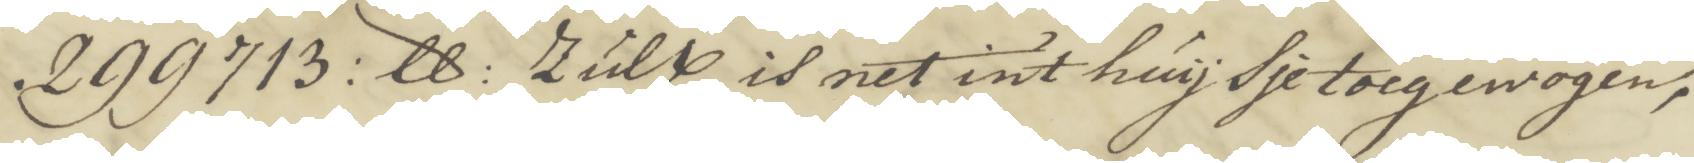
299713: lb: zulx is net in’t huijsje toegewogen,
